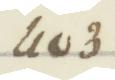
403
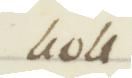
404
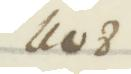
408
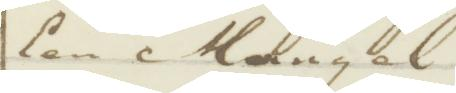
Een Mangel
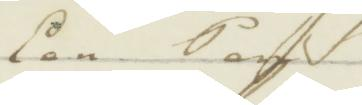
Een Pen
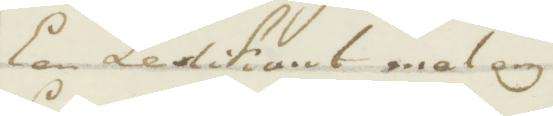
Een Ledikant met enz
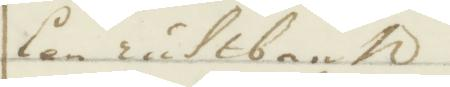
Een rustbank
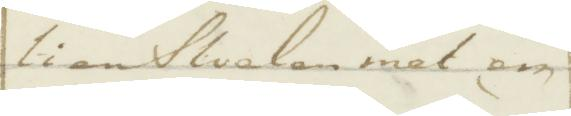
tien stoelen met enz
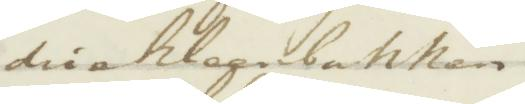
drie Kleerbakken
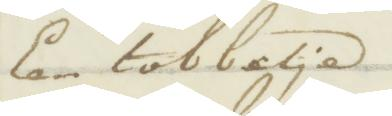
Een tobbetje
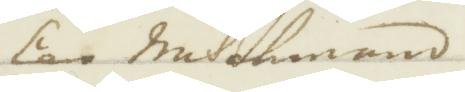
Een waschmand
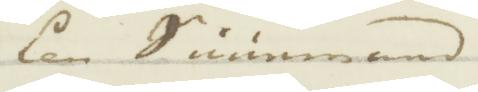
Een Vuurmand
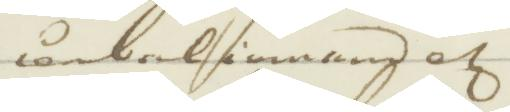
Een balimand etc
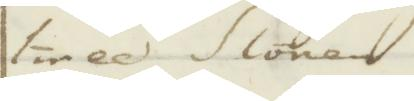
twee stonen
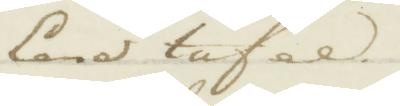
Eene tafel.
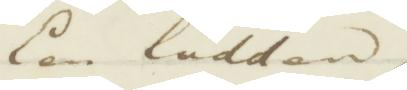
Een ladder
